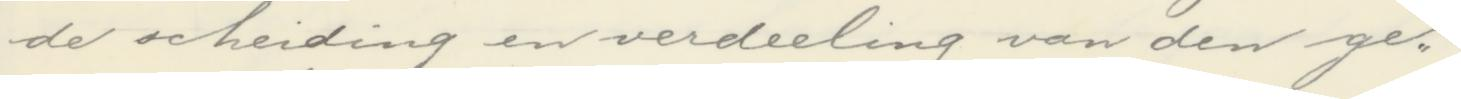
de scheiding en verdeeling van den ge„
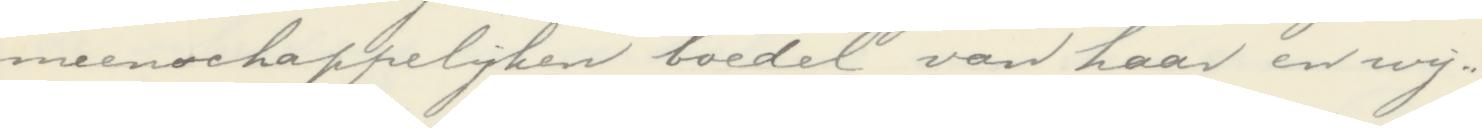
meenschappelijken boedel van haar en wij„
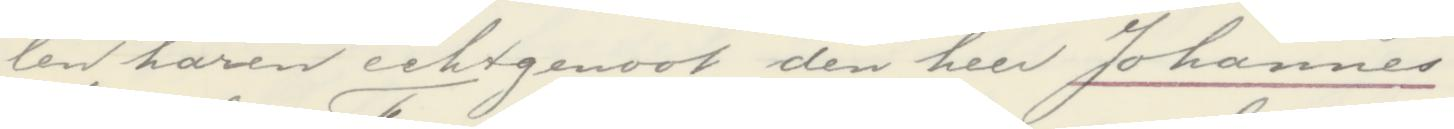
len haren echtgenoot den heer Johannes
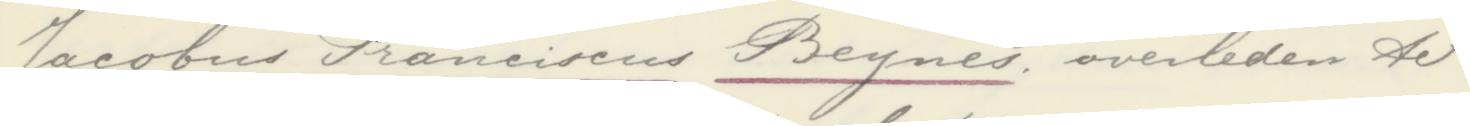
Jacobus Franciscus Beynes, overleden te
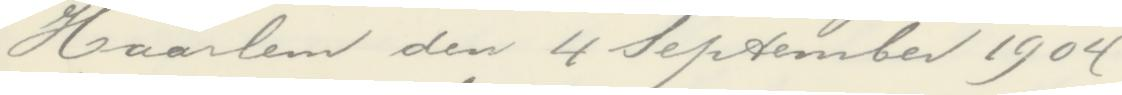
Haarlem den 4 September 1904
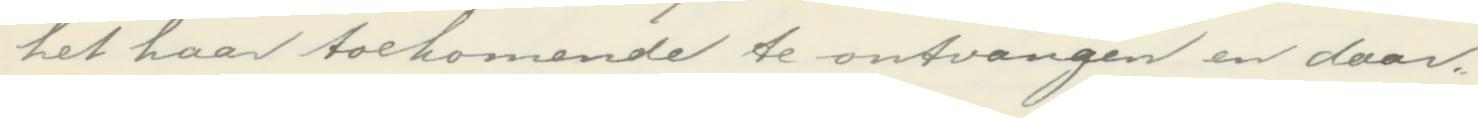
het haar toekomende te ontvangen en daar„
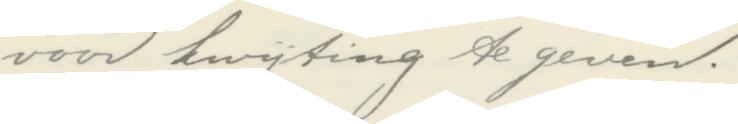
voor kwijting te geven.
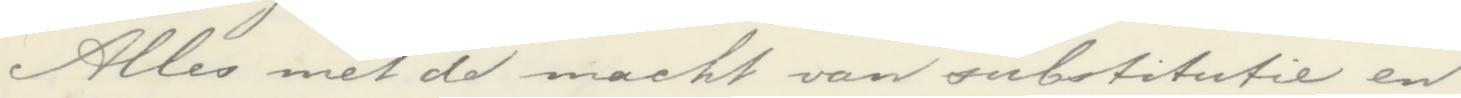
Alles met de macht van substitutie en
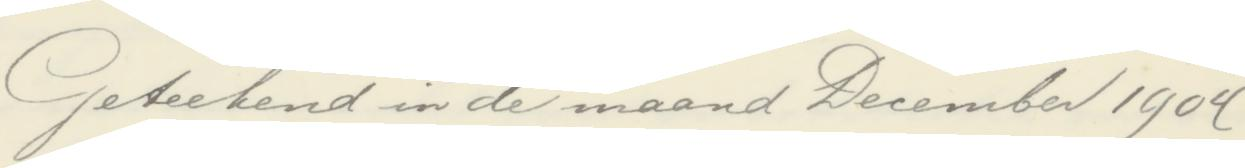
Geteekend in de maand December 1904
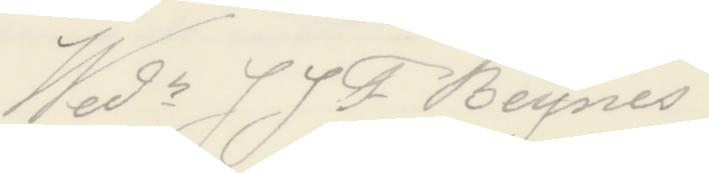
Wed-n JJ F Beijnes
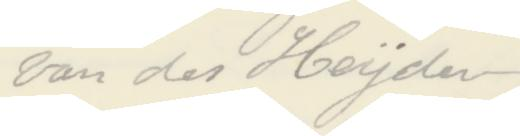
van der Heijden
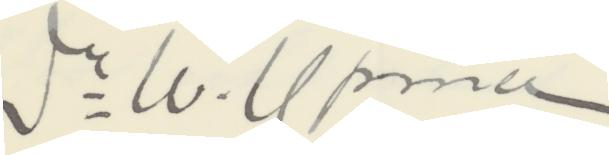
d=r W. Ypma
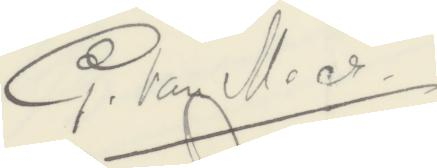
G. van Meer,
